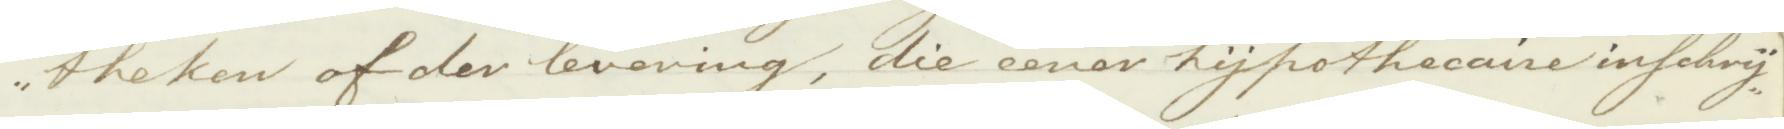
„theken of der levering, die eener hijpothecaire inschrij„
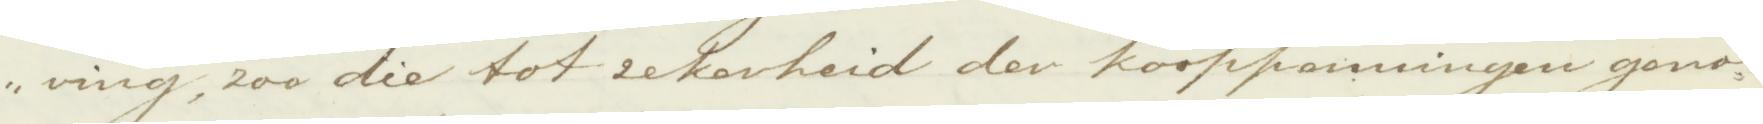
„ving, zoo die tot zekerheid der kooppenningen geno„
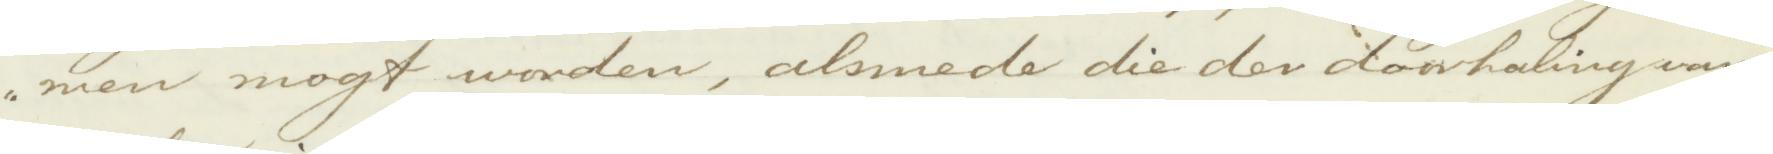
„men mogt worden, alsmede die der doorhaling van
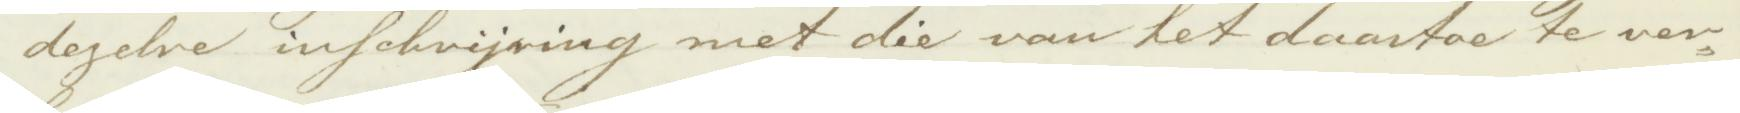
dezelve inschrijving met die van het daartoe te ver=
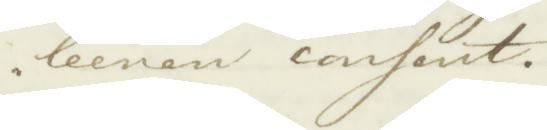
„leenen consent.
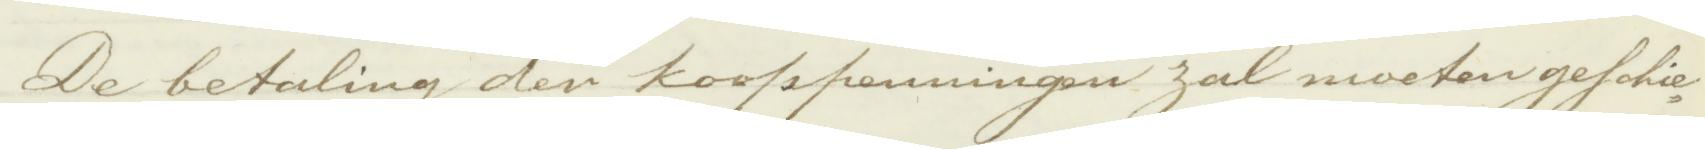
De betaling der kooppenningen zal moeten geschie=
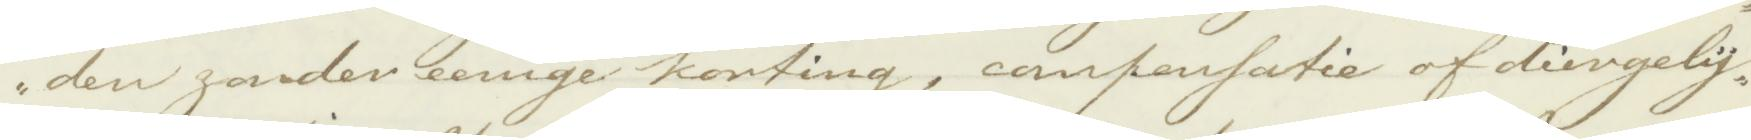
„den zonder eenige korting, compensatie of diergelij
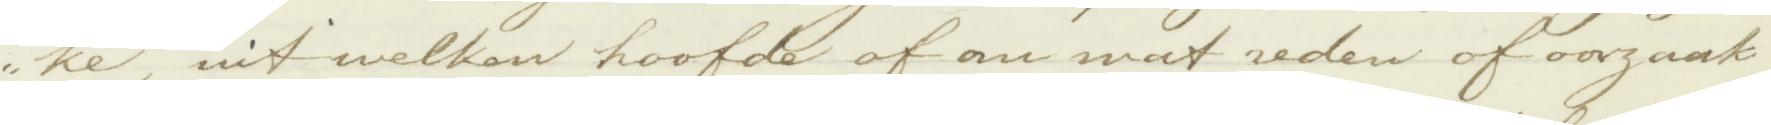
„ke, uit welken hoofde of om wat reden of oorzaak
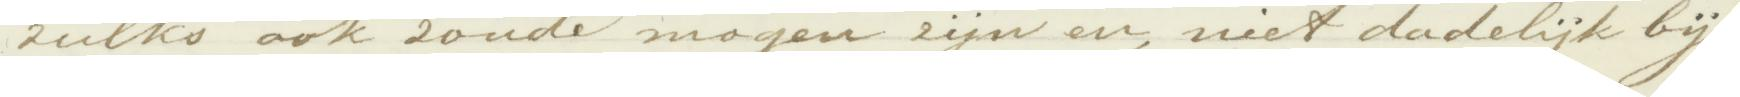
zulks ook zoude mogen zijn en, niet dadelijk bij
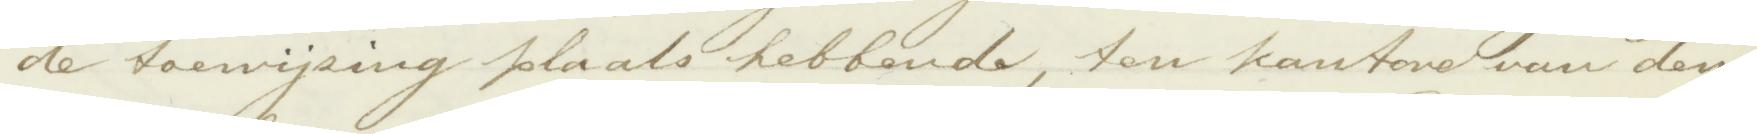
de toewijzing plaats hebbende, ten kantore van den
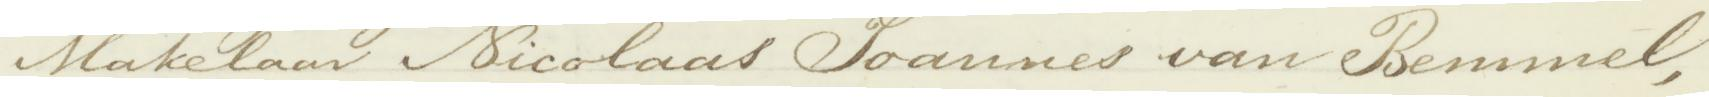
Makelaar Nicolaas Ioannes van Bemmel,
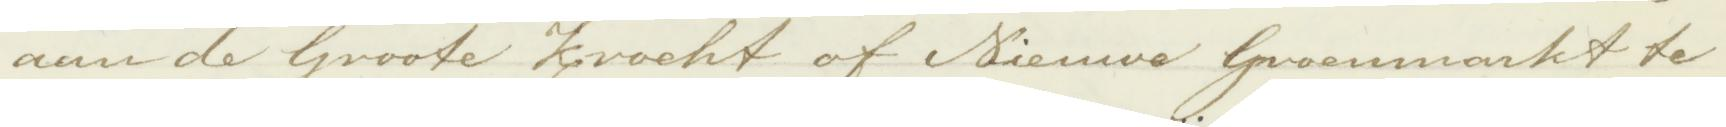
aan de Groote Krocht of Nieuwe Groenmarkt te
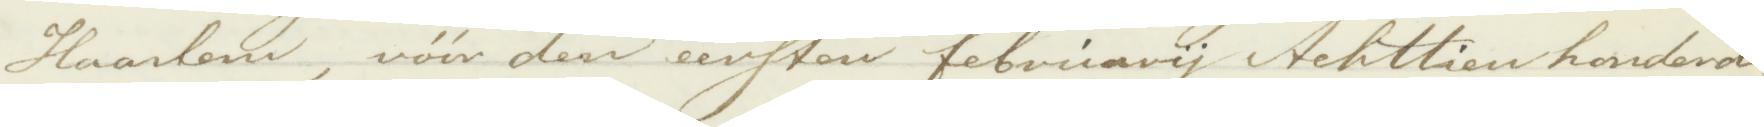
Haarlem, vóór den eersten februarij Achttien honderd
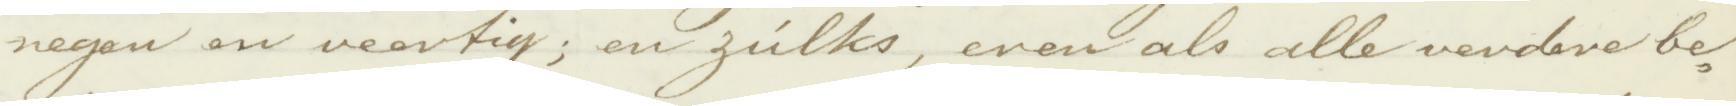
negen en veertig; en zulks, even als alle verdere be=
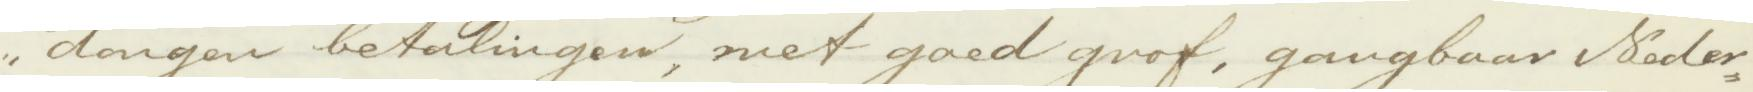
„dongen betalingen, met goed grof, gangbaar Neder=
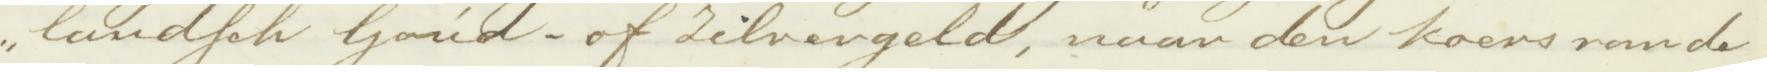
„landsch Goud- of Zilvergeld, naar den koers van de
